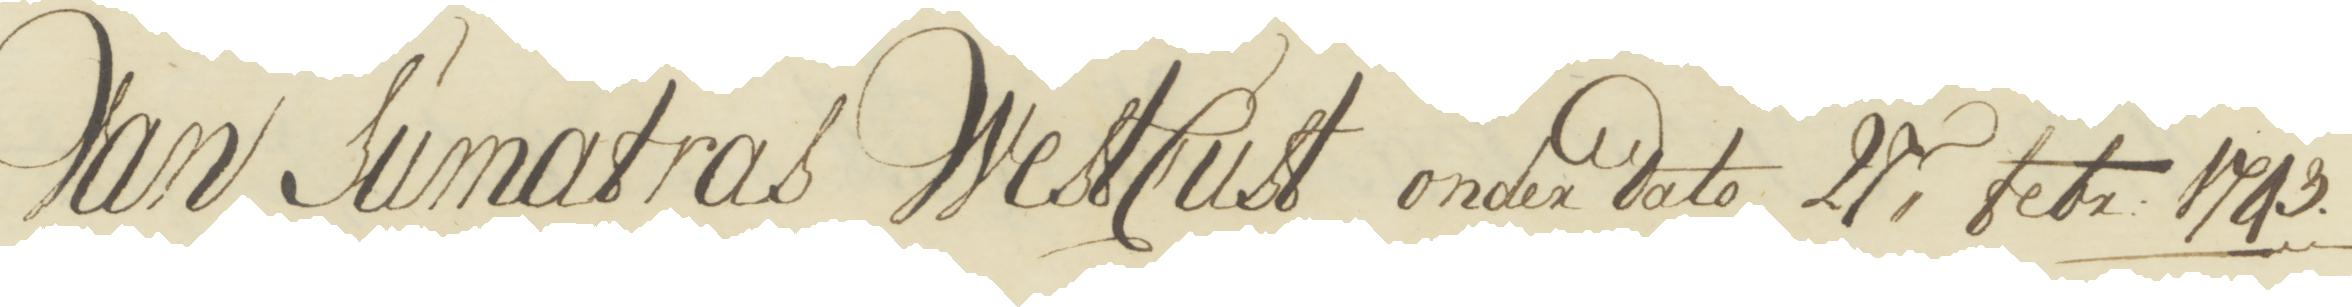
Van Sumatras WestCust onder dato 27„ febr: 1743.
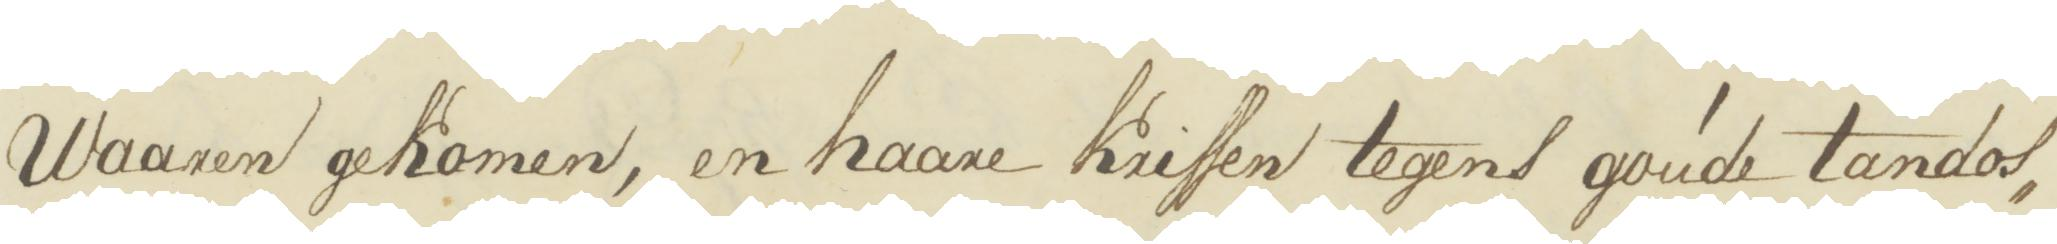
Waaren gekomen, en haare krissen tegens goude tandas„
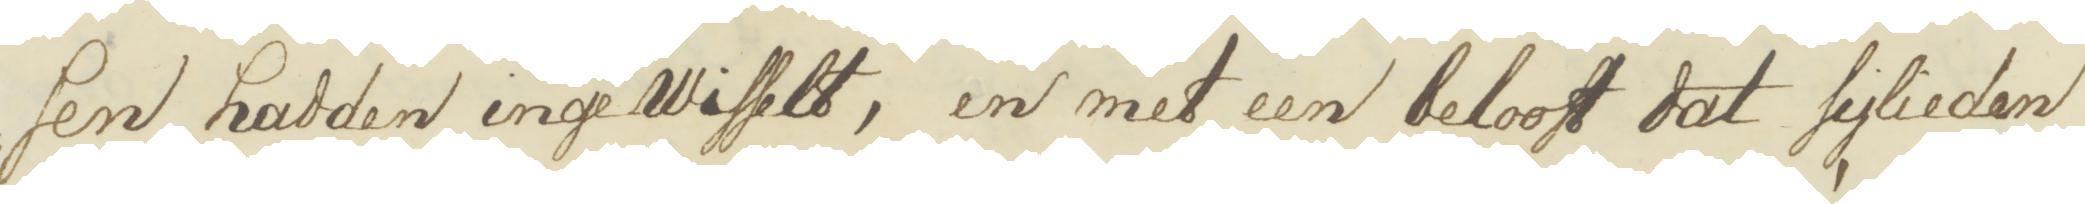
sen hadden ingewisselt, en met een belooft dat sijlieden
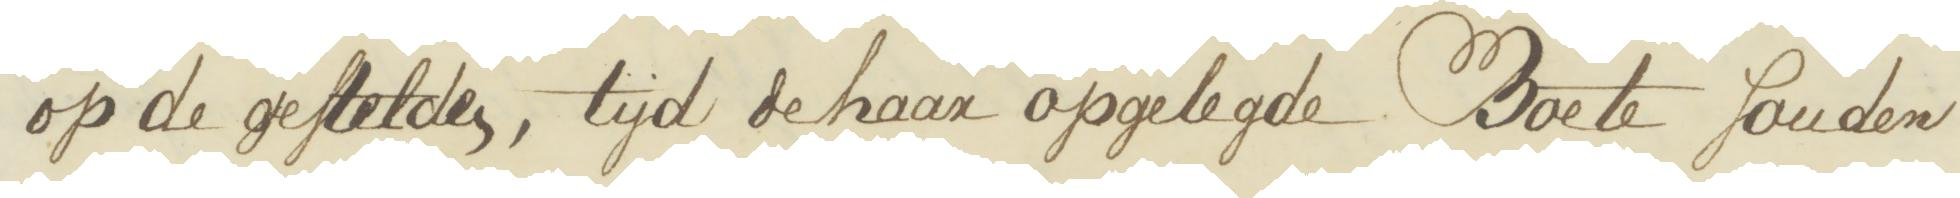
op de gestelden, tijd de haar opgelegde Boete souden
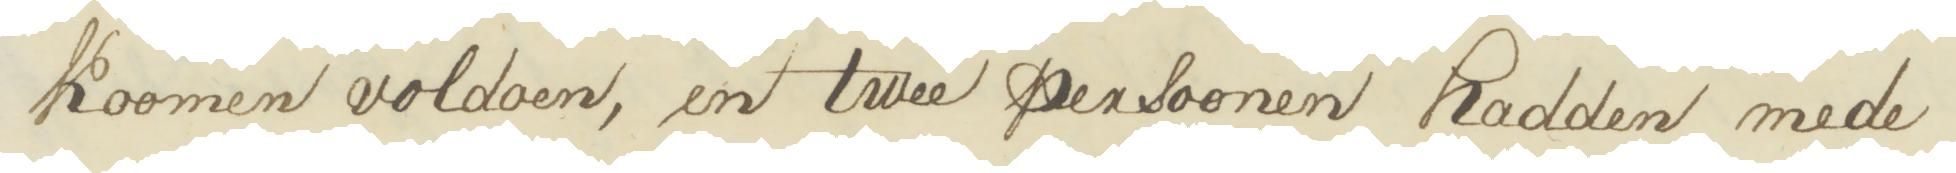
koomen voldoen, en twee persoonen hadden mede
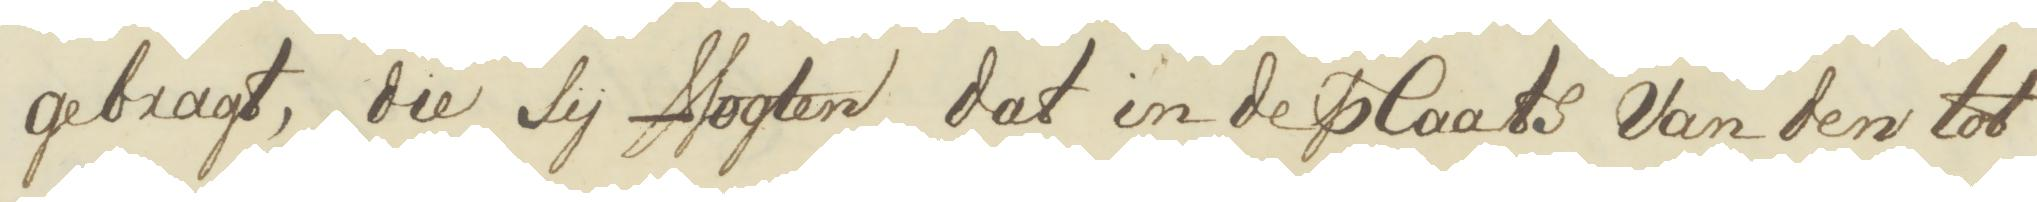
gebragt, die sij versogten dat in de plaats van den tot
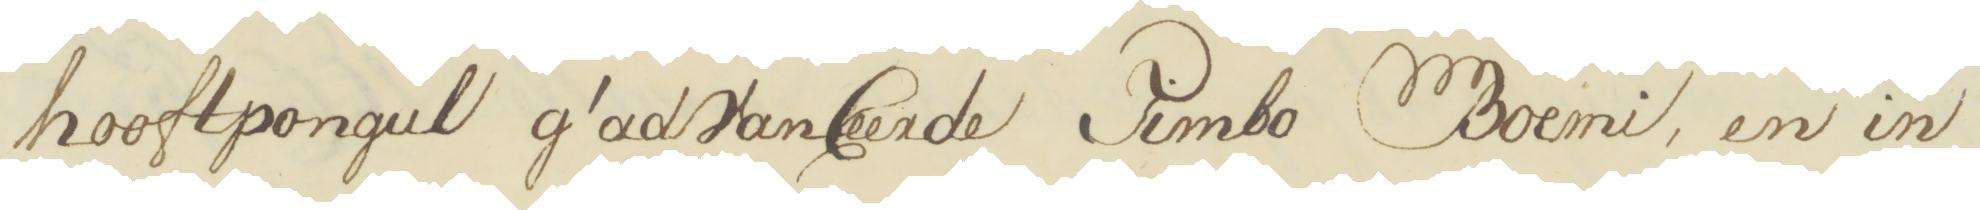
hooftpongul g’advanceerde Timbo Boemi, en in
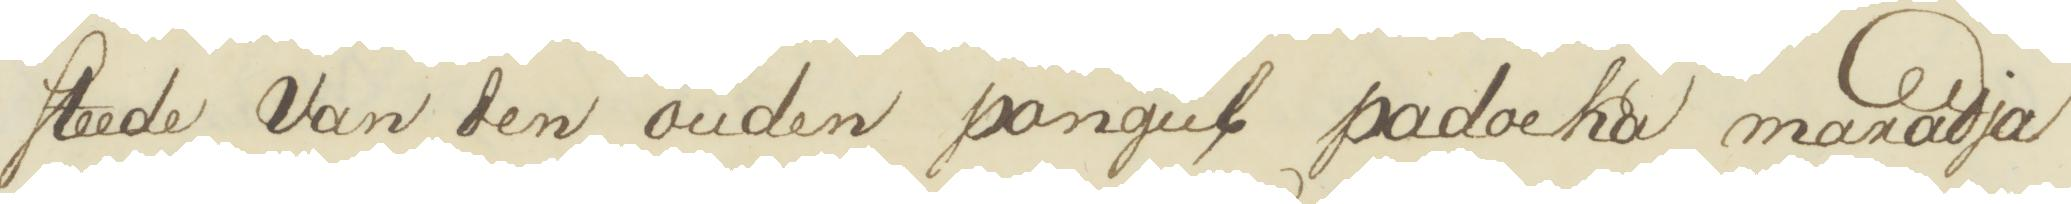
steede van den ouden pongul padoeka maradja
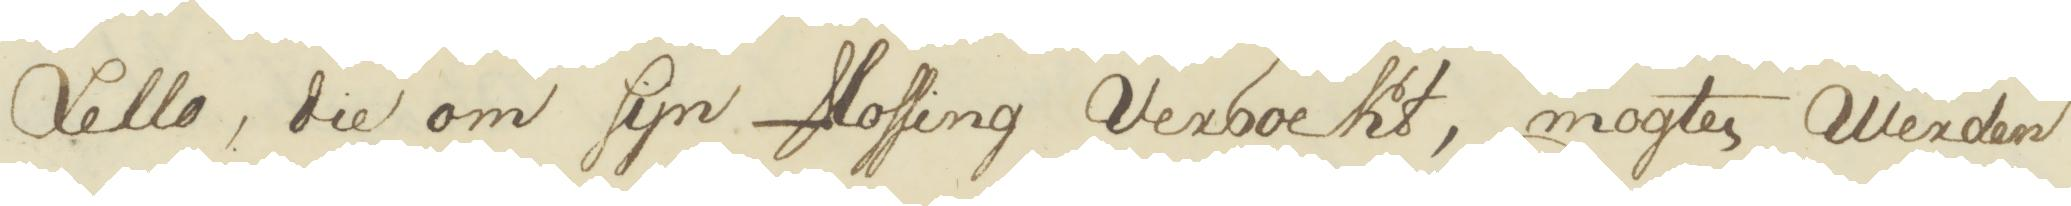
Lello, die om sijn verlossing versoekt, mogten werden
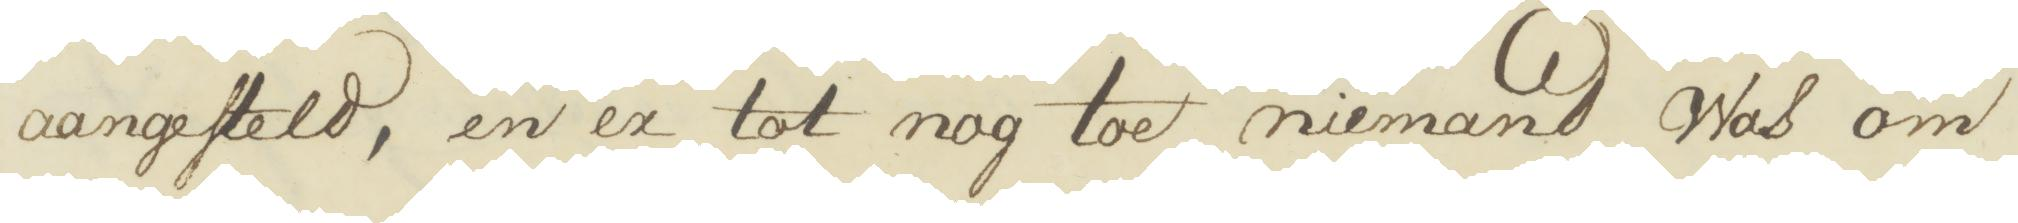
aangesteld, en er tot nog toe niemand was om
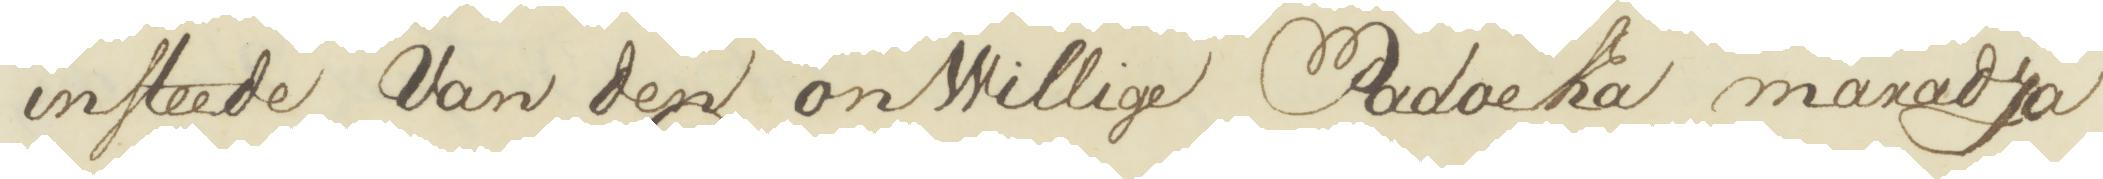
insteede van den onwillige Padoeka maradja
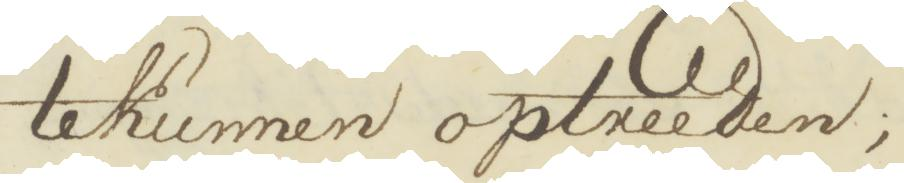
tekunnen optreeden;
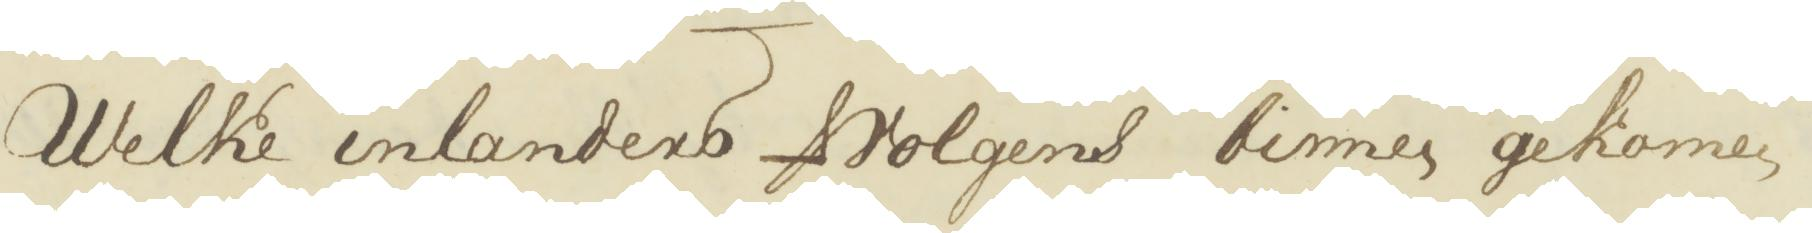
Welke inlanders vervolgens binnen gekomen
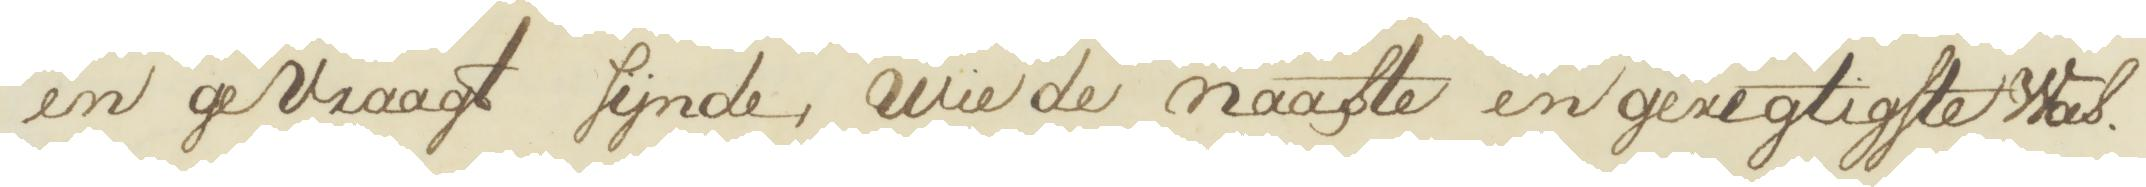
en gevraagt sijnde, wie de naaste en geregtigste was.
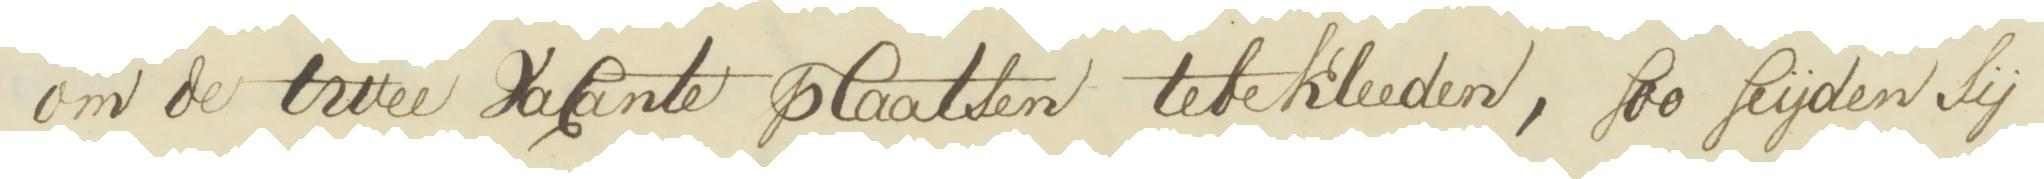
om de twee Vacante plaatsen tebekleeden, soo seijden sij
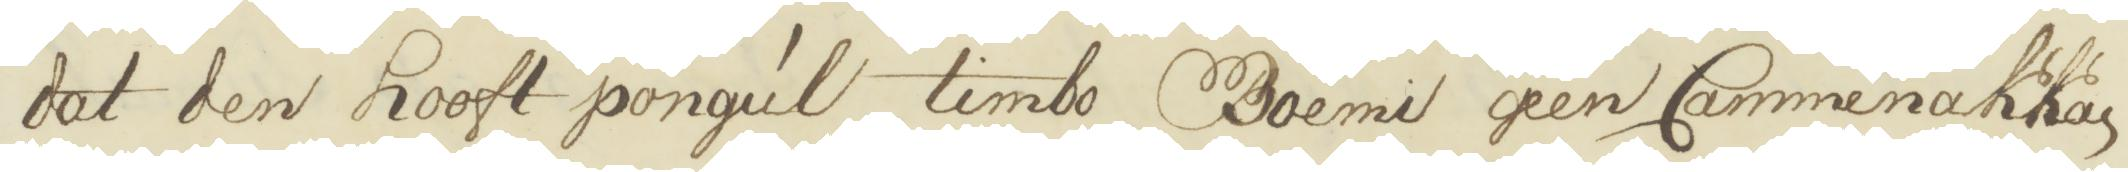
dat den hooft pongul timbo Boemi geen Cammenakkan
